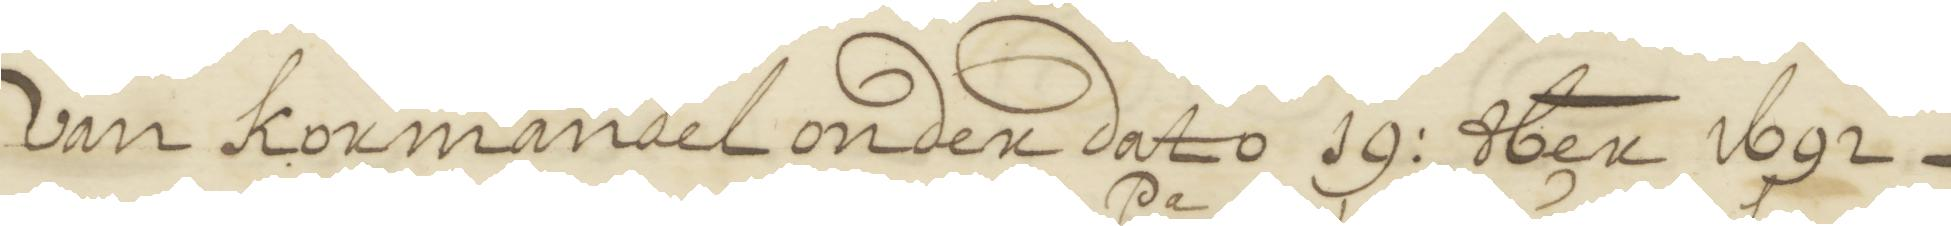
van kormandel onder dato 19: 8ber 1692 —
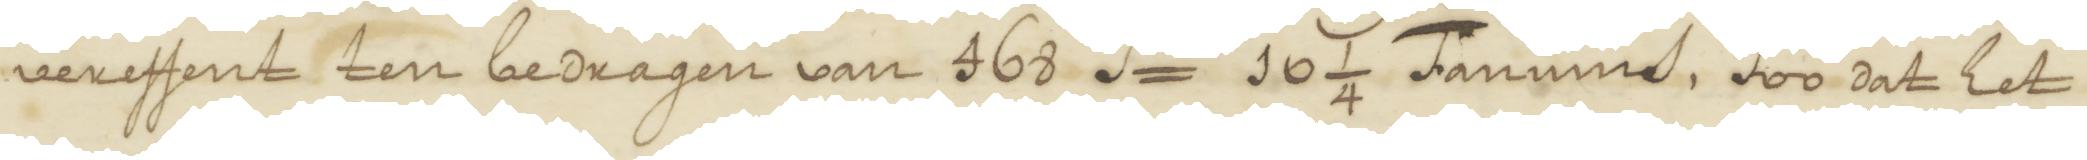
vereffent ten bedragen van 468 P=a 10¼ Fanums, soo dat het
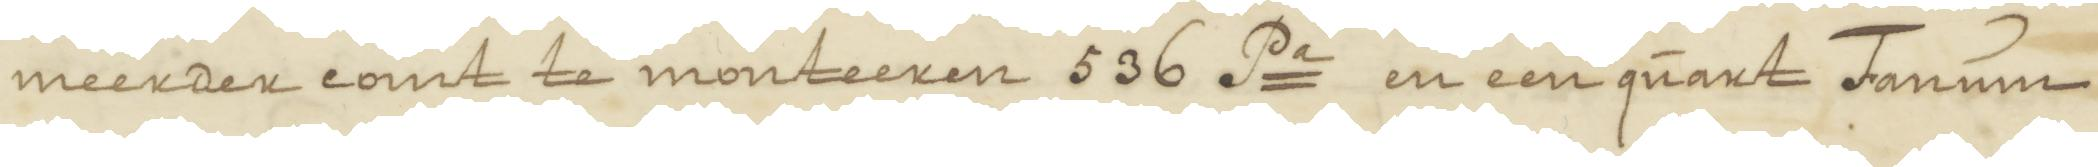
meerder comt te monteeren 536 P=a en een quart Fanum
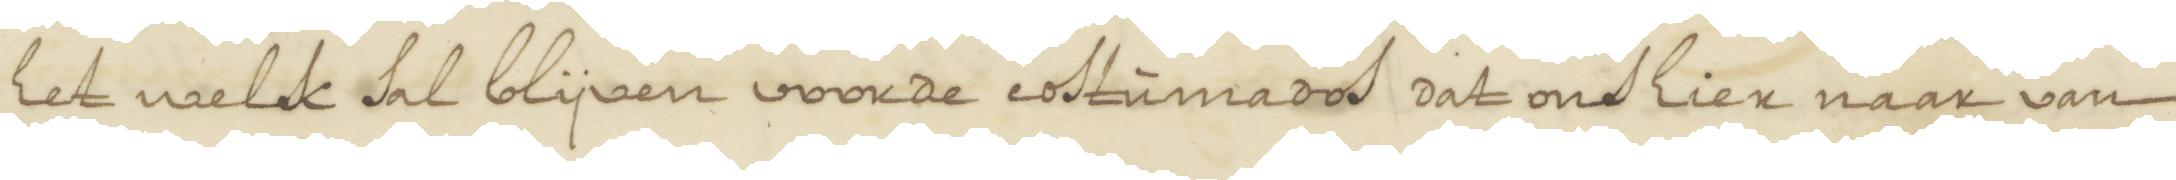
het welk sal blijven voor de costumados dat ons hier naar van
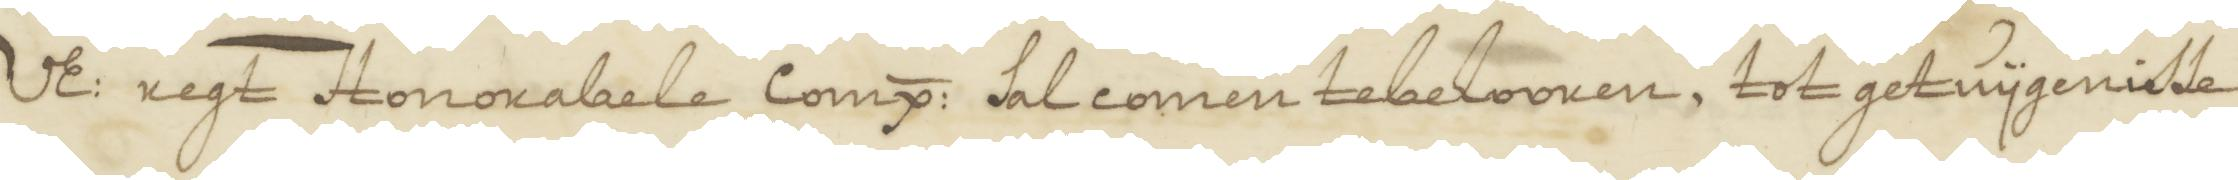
VE: regt Honorabele Comp: sal comen te behooren, tot getuijgenisse
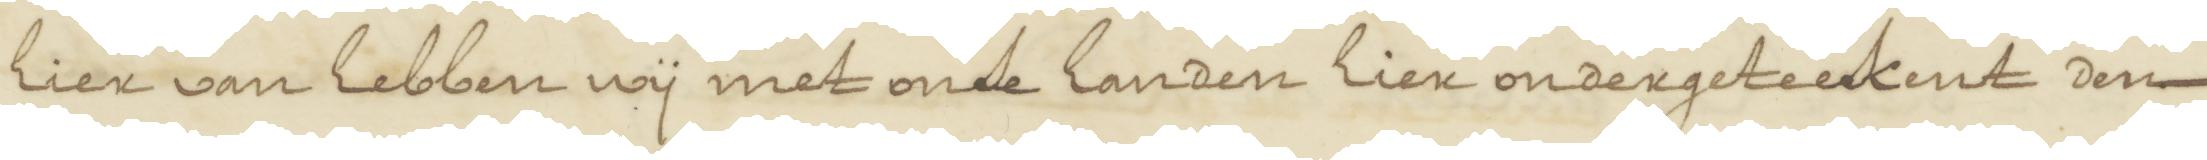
hier van hebben wij met onse handen hier ondergeteekent den
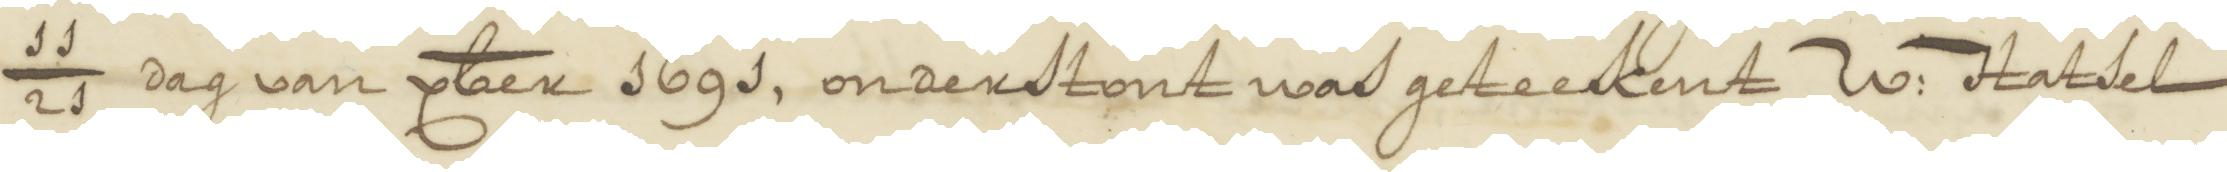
11/21 dag van xber 1691, onderstont was geteekent W: Hatsel
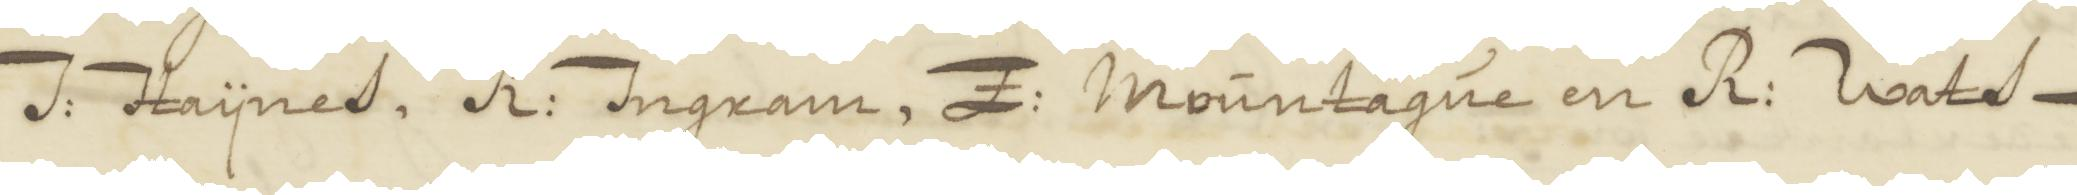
I: Haijnes, R: Ingram„ E: Mountague en R: Wats
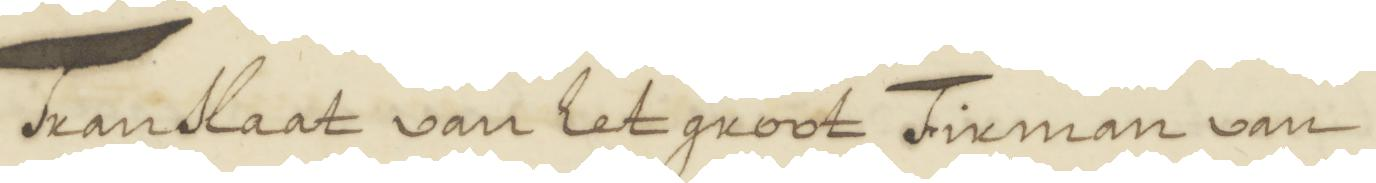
Translaat van het groot Firman van
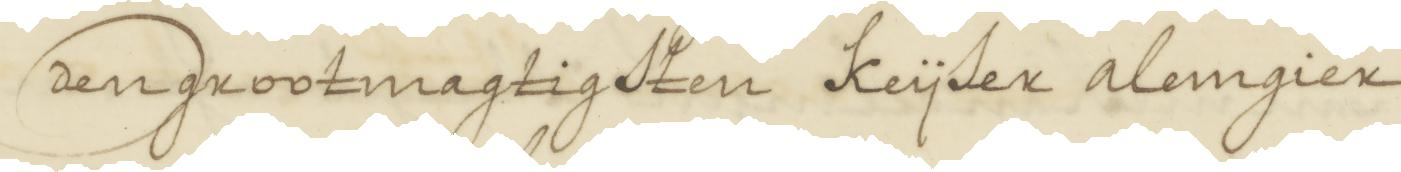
den groot magtigsten keijser alemgier
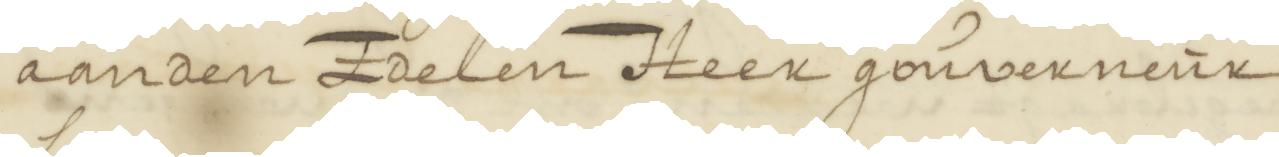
aan den Edelen Heer gouverneur
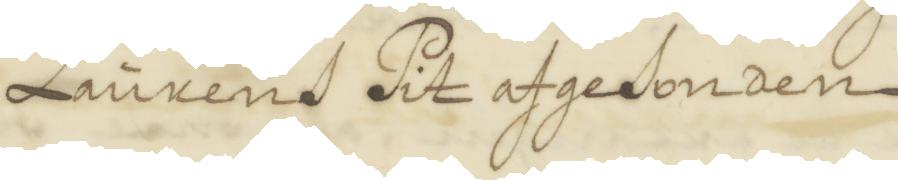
Laurens Pit afgesonden
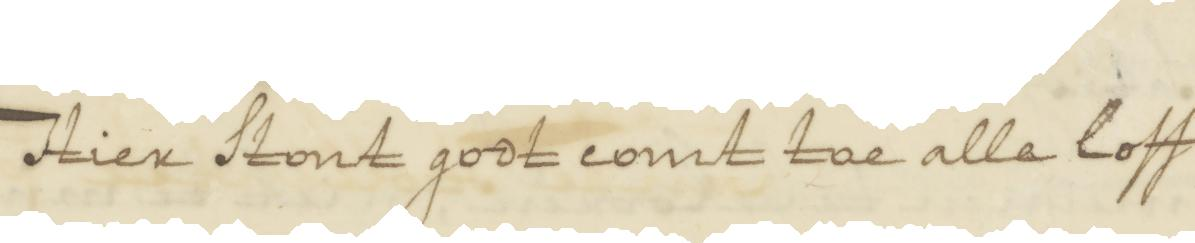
Hier stont godt comt toe alle loff
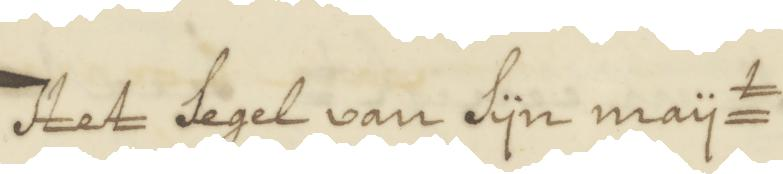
Het segel van sijn maij=t
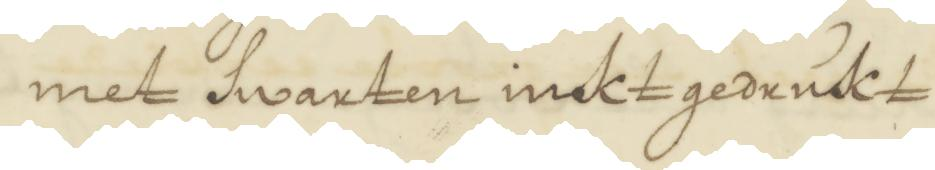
met swarten inkt gedrukt
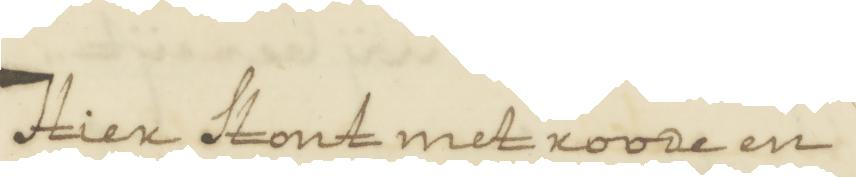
Hier stont met roode en
